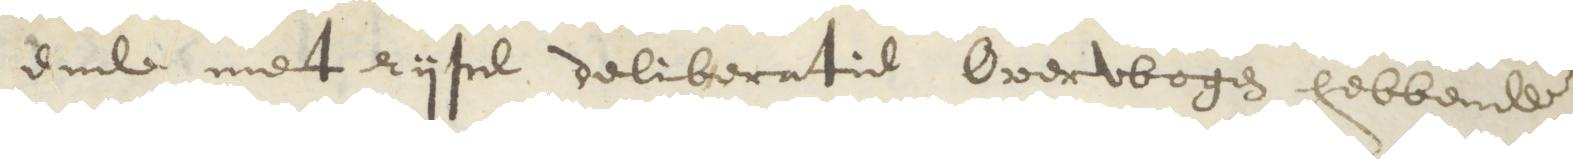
ende met rijpe deliberatie Overwogen hebbende
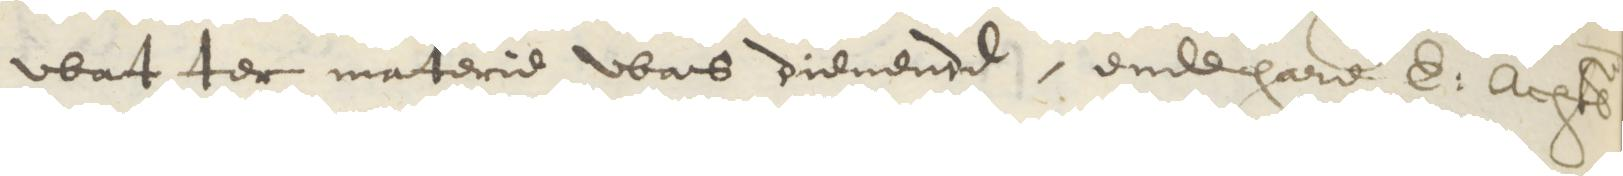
wat ter materie was dienende, ende hare E: Achtb
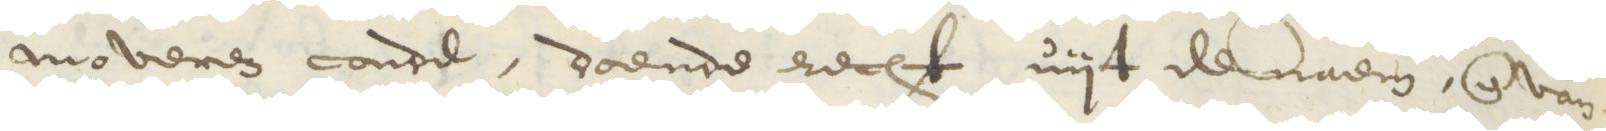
moveren conde, doende recht uijt eennen, ende van
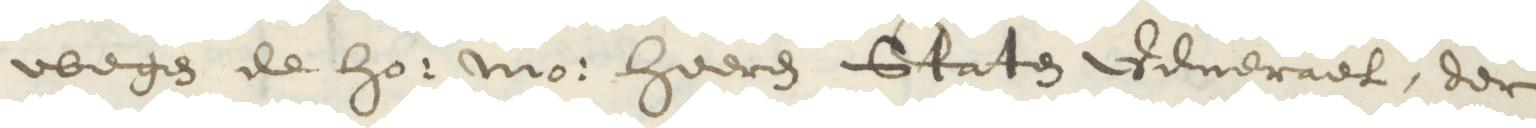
wegen de ho: mo: heeren staten Generael, der
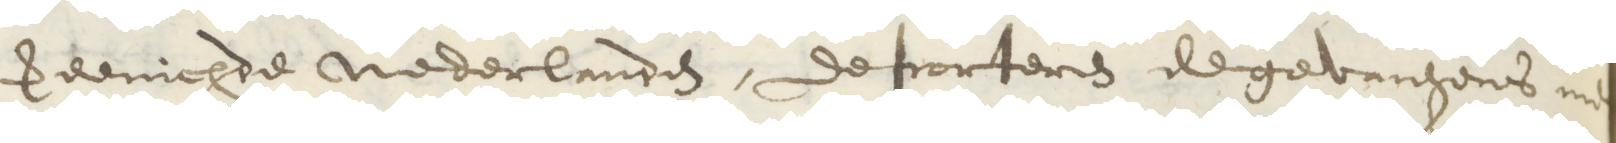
vereenichde nederlanden, deporteren de gevangenes me
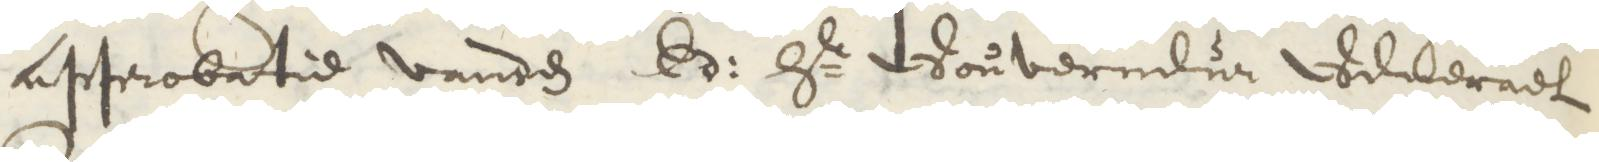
approbatie vanden Ed: H=r Gouverneur Generael
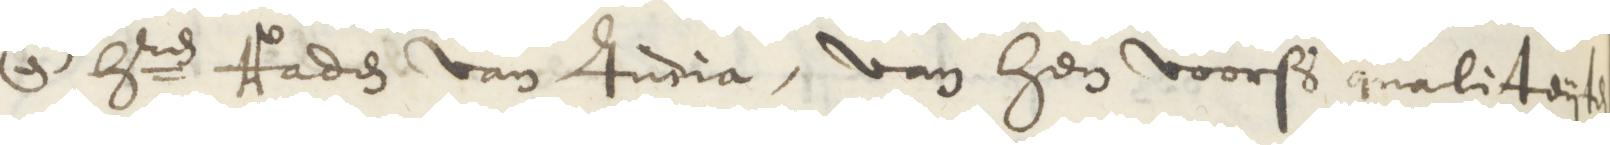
ende h=ren Raden van India, van hen voorsz qualiteijten
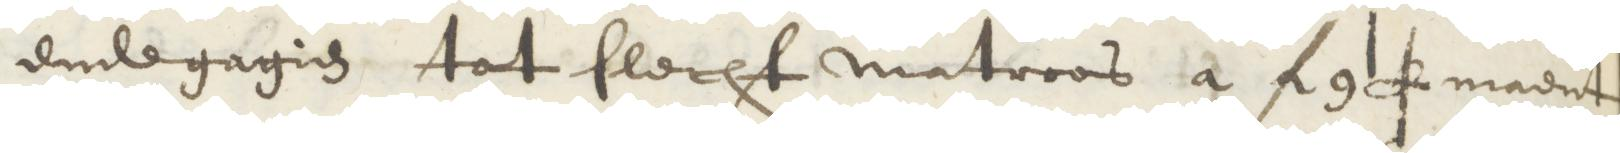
en degagien tot slecht matroos a ƒ 9 p maent
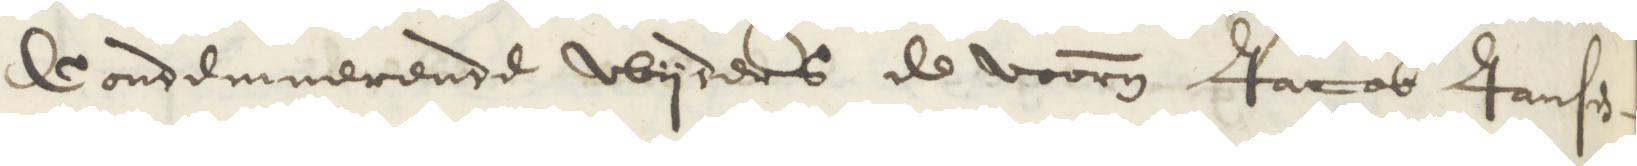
Condemnerende wijders de voorn Jacob Jansen
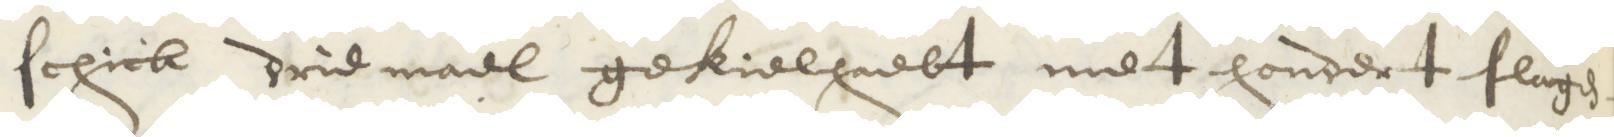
schick drie mael gekielhaelt met hondert slagen
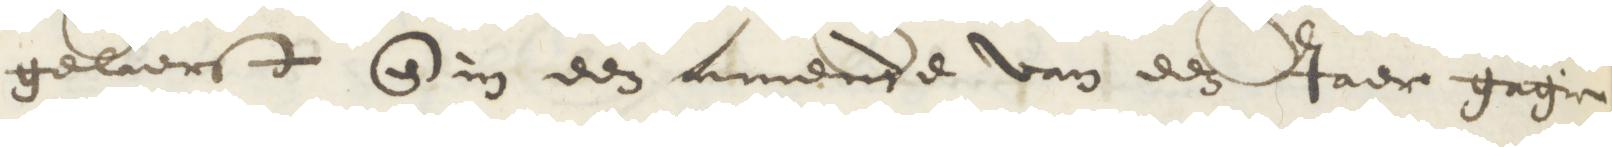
gelaerst ende in een Amende van een Jaer gagie
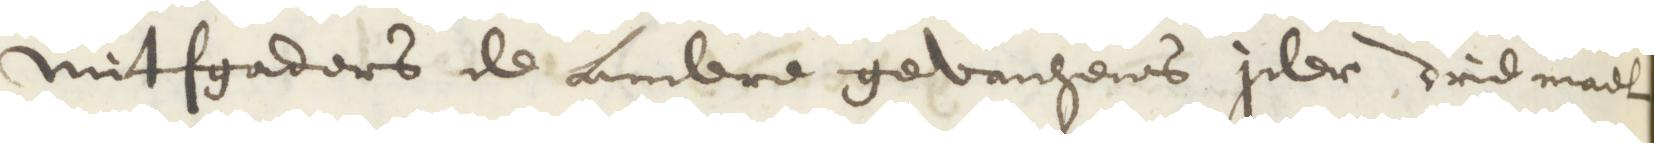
mitsgaders de Andere gevangens jder drie mael
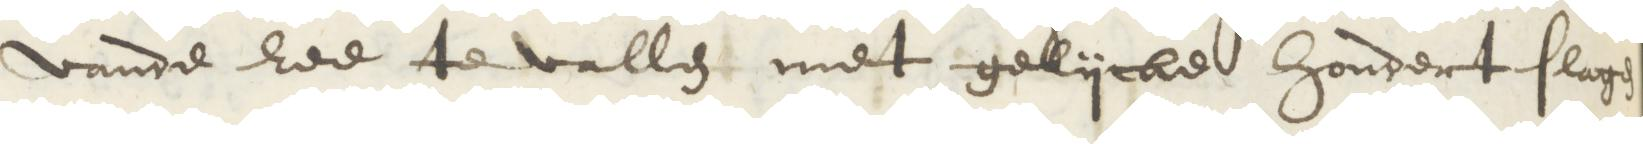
vande ree te vallen met gelijcke hondert slagen
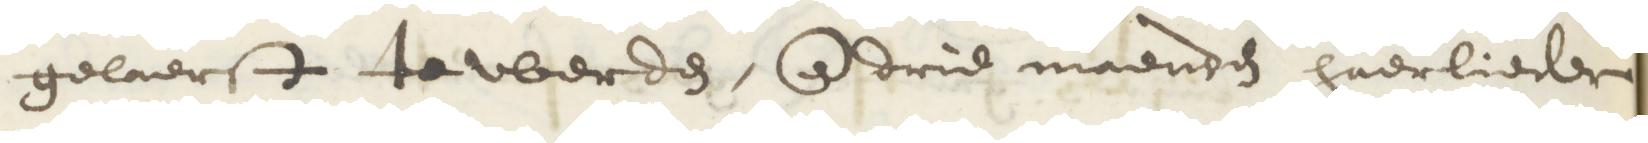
gelaerst te werden, ende drie maenden haerlieder
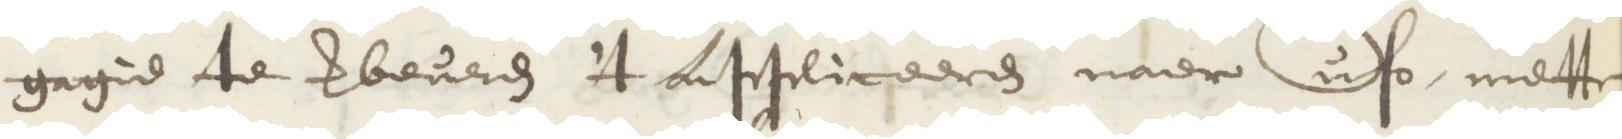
gagie te verbeuren ’t Appliceeren naer uso, mette
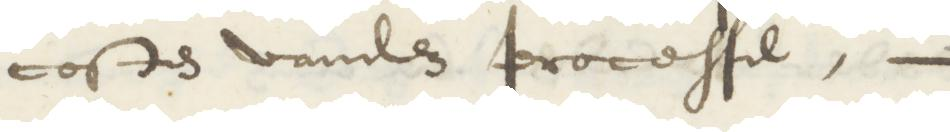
costen vanden processe, —
